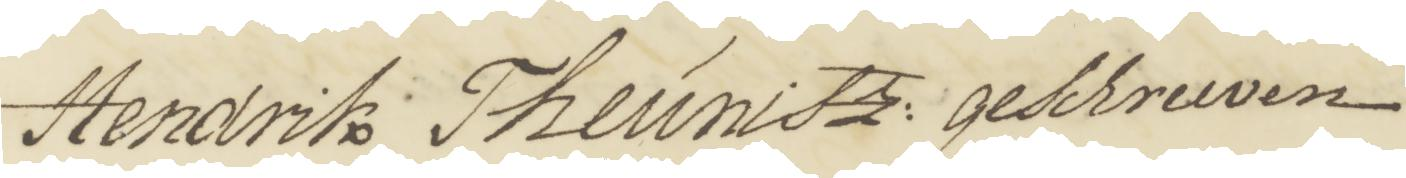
Hendrik Theunisz: geschreeven
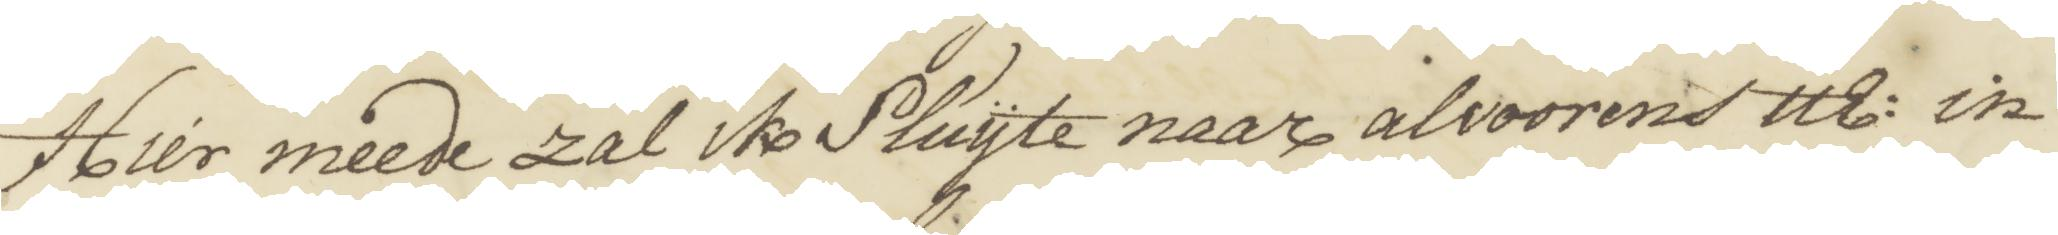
Hier meede zal ik Sluijte naar alvoorens UE: in
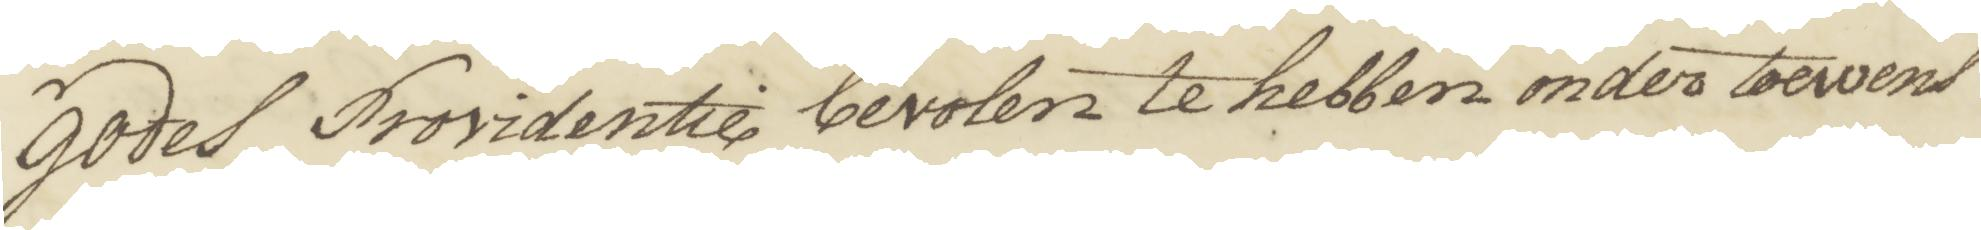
godes Providentie bevolen te hebben onder toewens
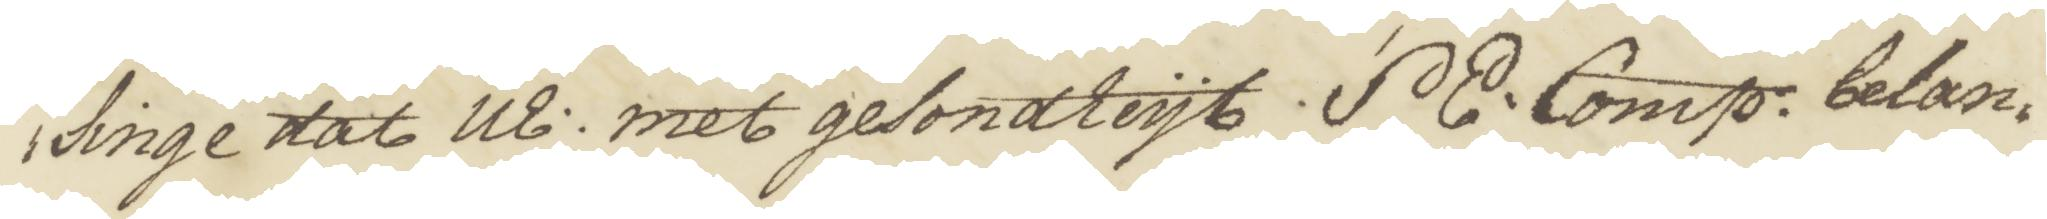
„singe dat UE: met gesondheijt 'S E: Comp:s belan„
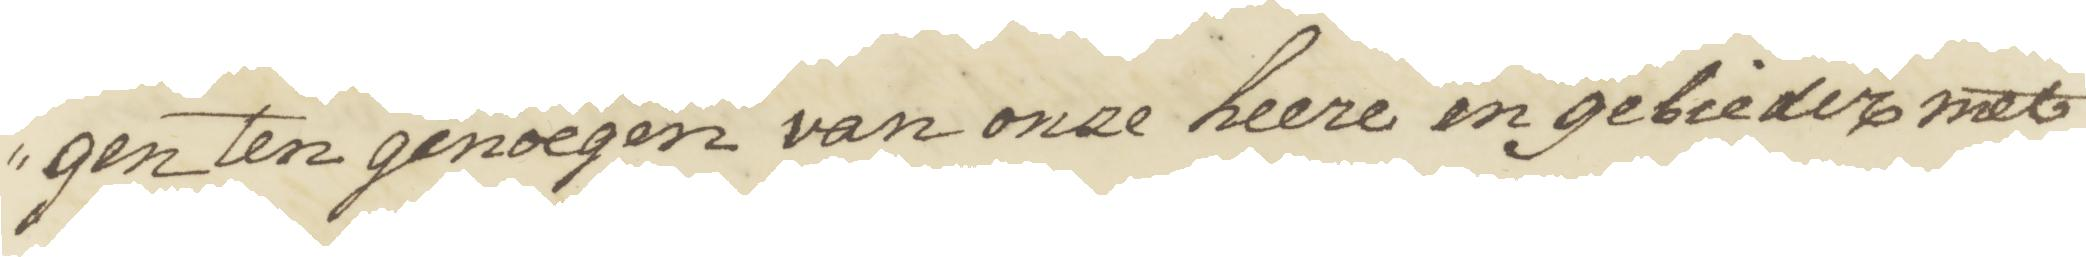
„gen ten genoegen van onze heere en gebieder met
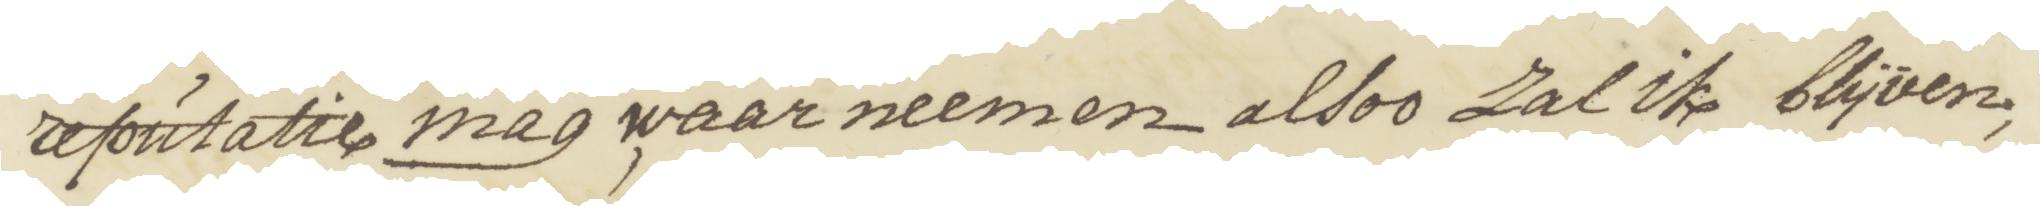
reputatie mag waar neemen alsoo zal ik blijven,
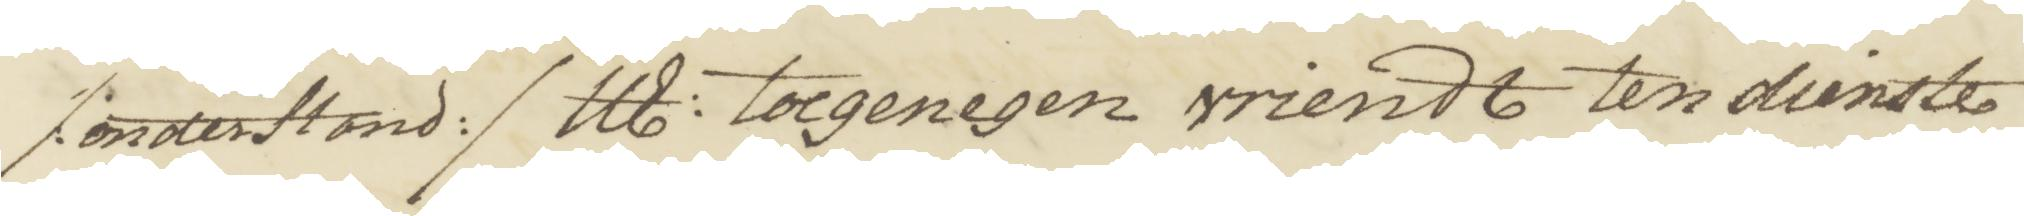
/:onderstond:/ UE: toegenegen vriendt ten dienste
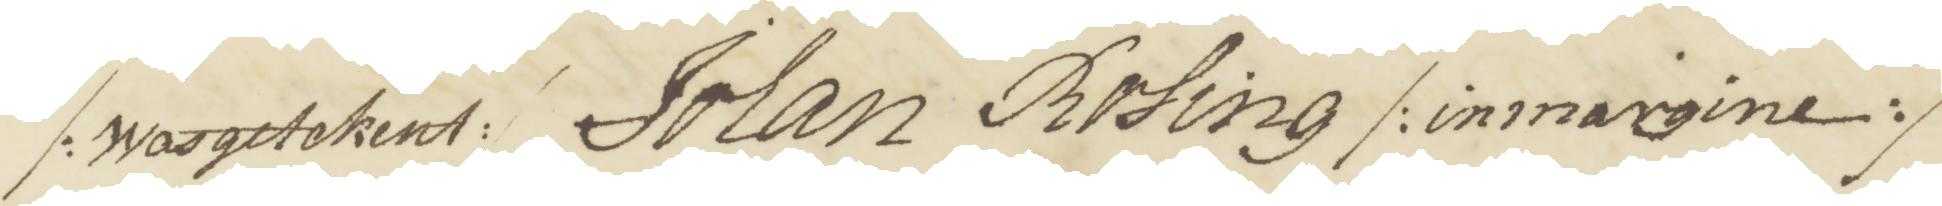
/:was getekent:/ Johan Rosing /:in margine:/
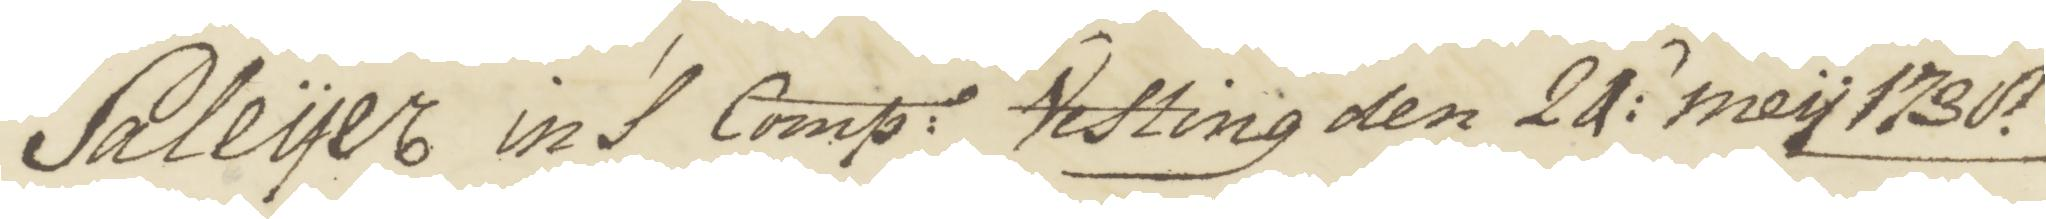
Saleijer in ’s Comp:s Vesting den 24:' meij 1738.
